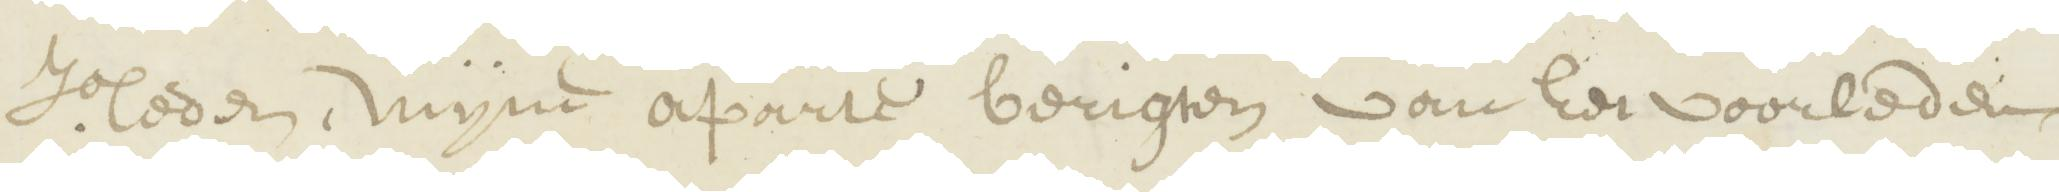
I.o leden, mijne aparte berigten van het voorleden,
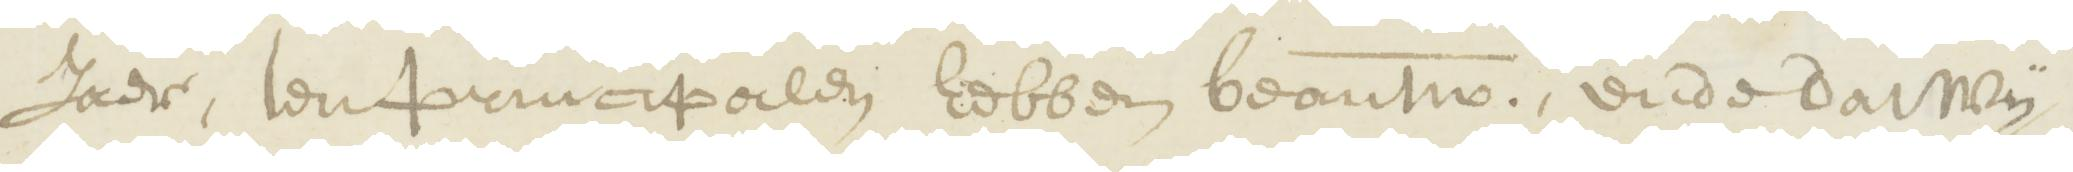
Iaer, ten principalen hebben beantw., ende dat Wij
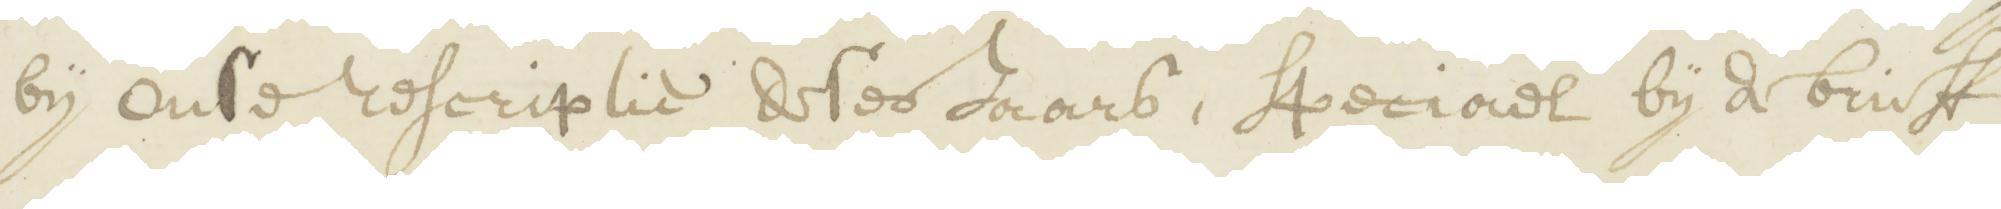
bij onse rescriptie deses Iaars, speciael bij de brieff
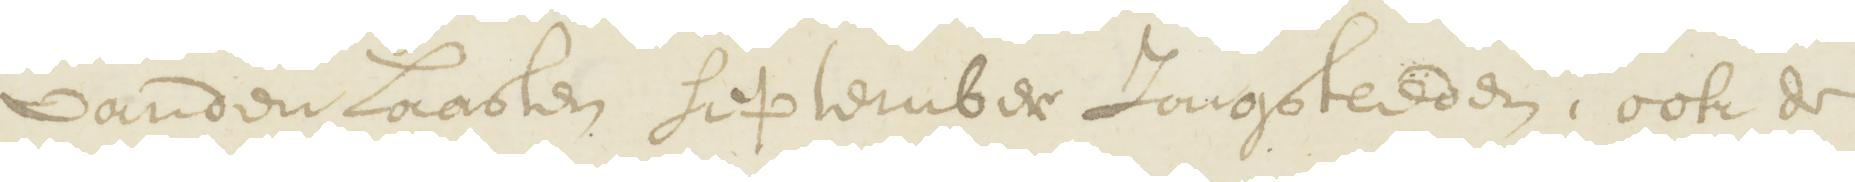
van den Laasten September Iongstleden, ook de
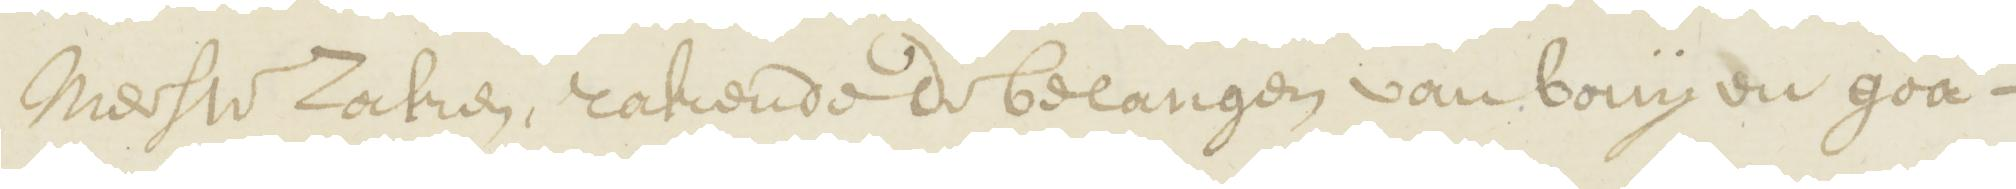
Meeste Zaken, rakende de belangen van bonij en goa -
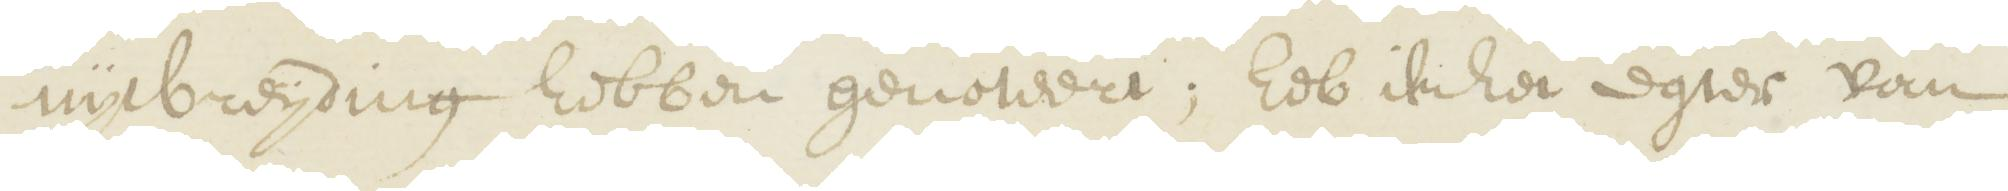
uijtbreijding hebben genoteert; heb ik het egter van
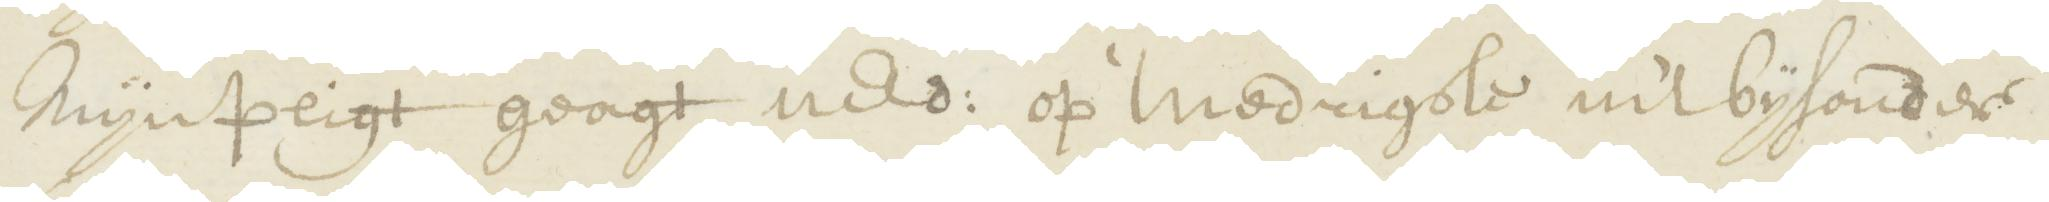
Mijn pligt geagt uEd: op 'tnedrigste in 't bijsonder
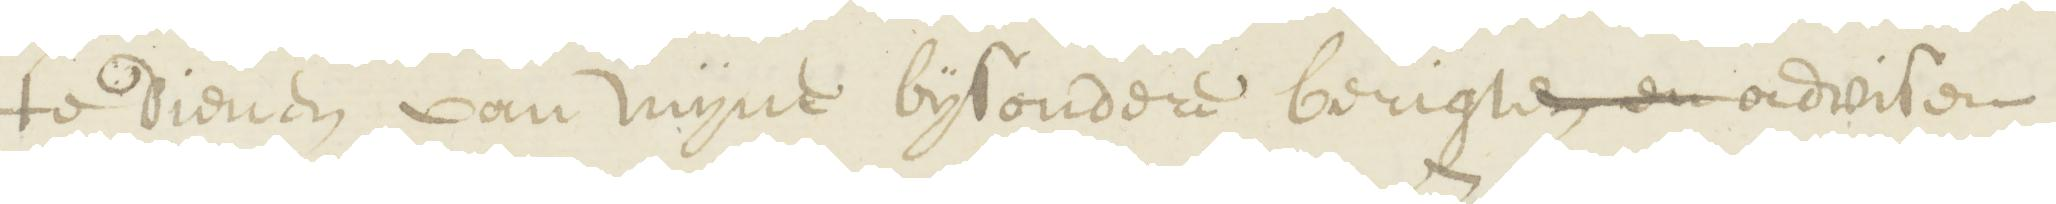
te dienen van mijne bijsondere berigten en advisen
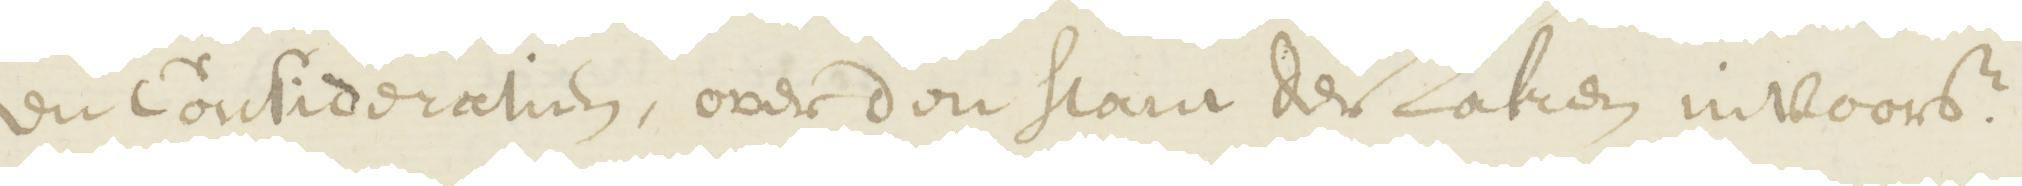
en consideratien, over den Stant der Zaken invoors:e
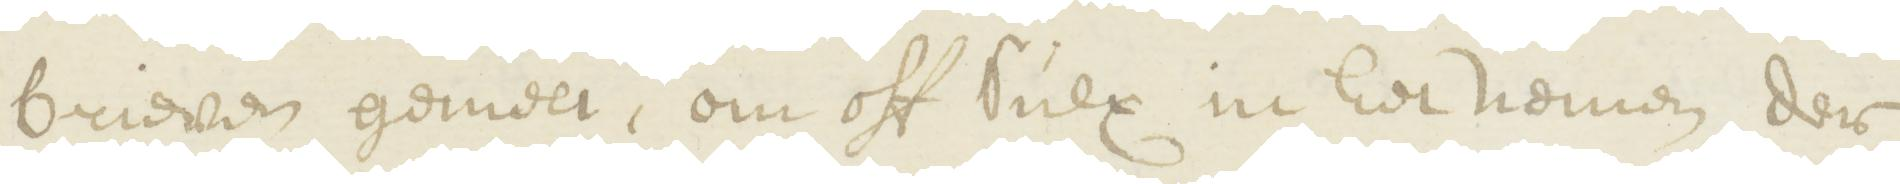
brieven gemelt, om off Sulx in het nemen der
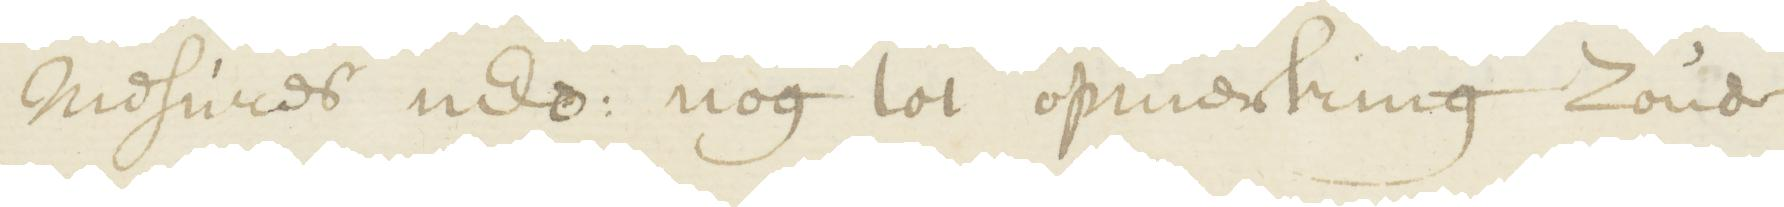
mesures uEd: nog tot opmerking Zoude
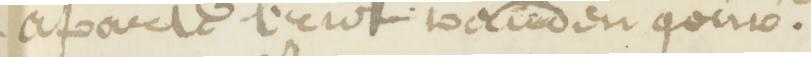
aparte brief vanden gouv.r
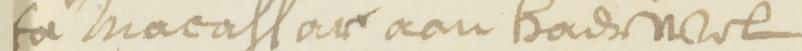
tot macassar aan haer wel
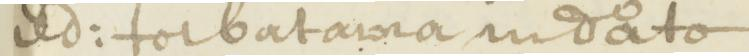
Ed: tot batavia in dato
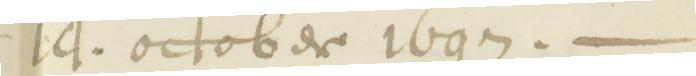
14. october 1697.-
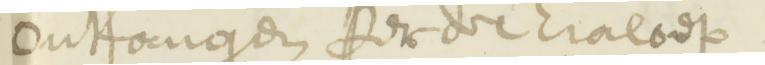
ontfangen per de chialoep
